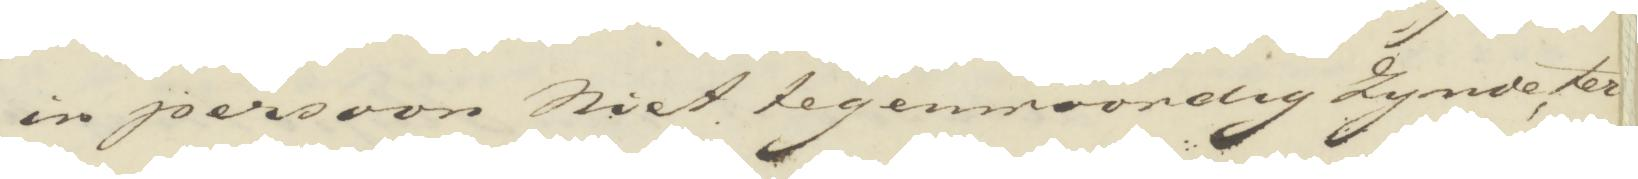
in persoon niet tegenwoordig Zynde, ter
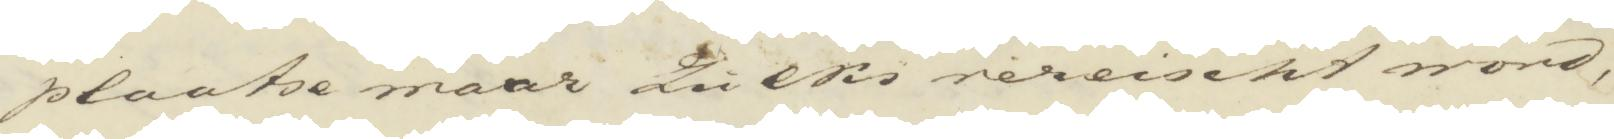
plaatse maar zulks vereischt word,
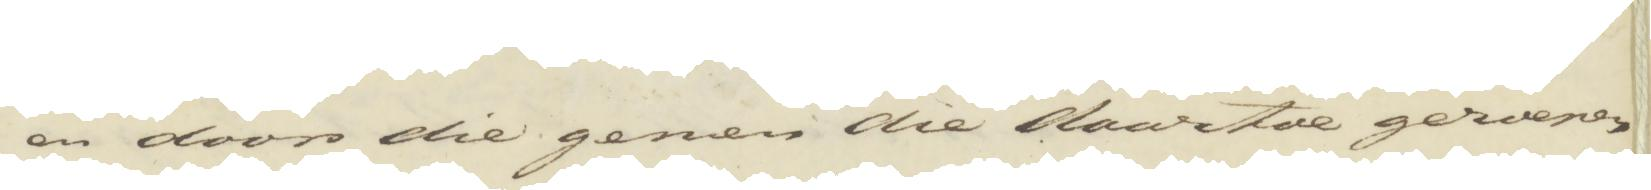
en door die genen die daartoe geroepen
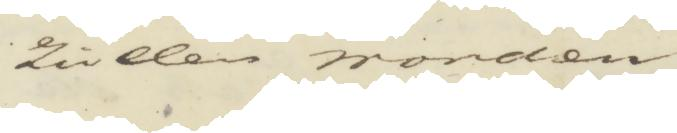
zullen worden
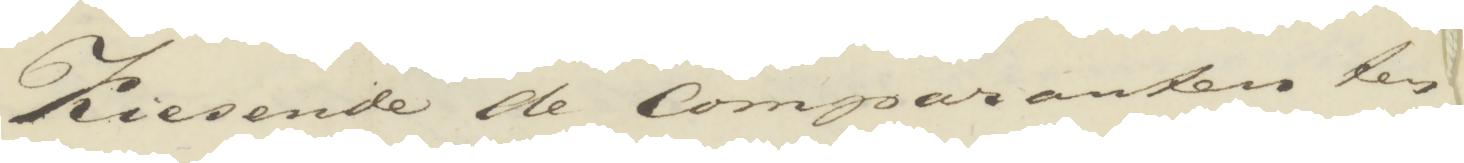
Kiesende de comparanten ten
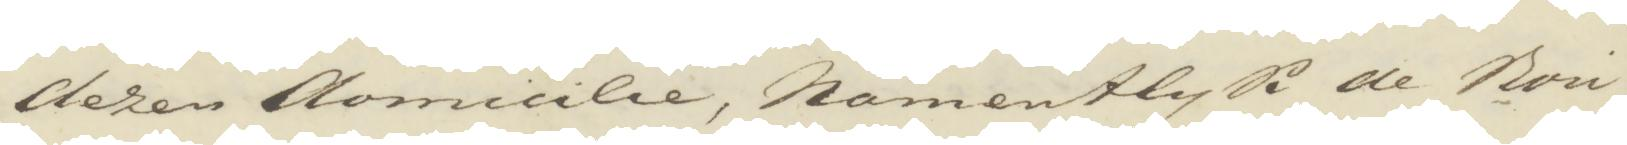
dezen domicilie, namentlyk de Vrou
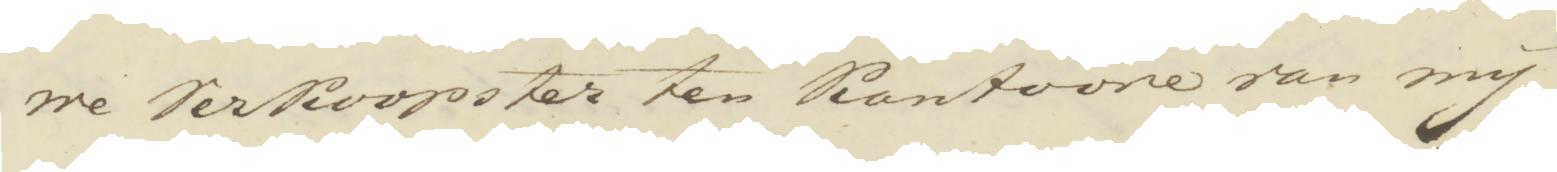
we Verkoopster ten Kantoore van mij
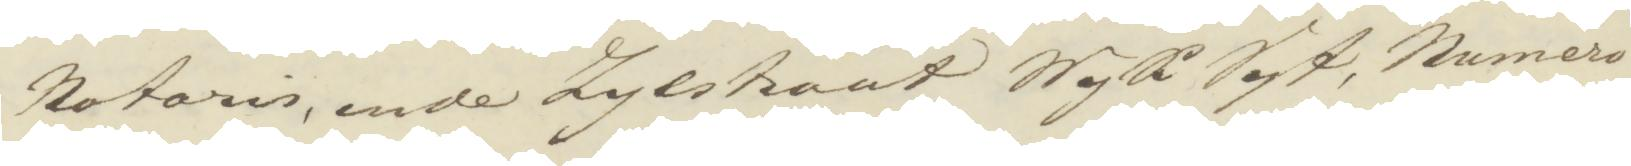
Notaris, inde Zylstraat Wyk Vyf, Numero
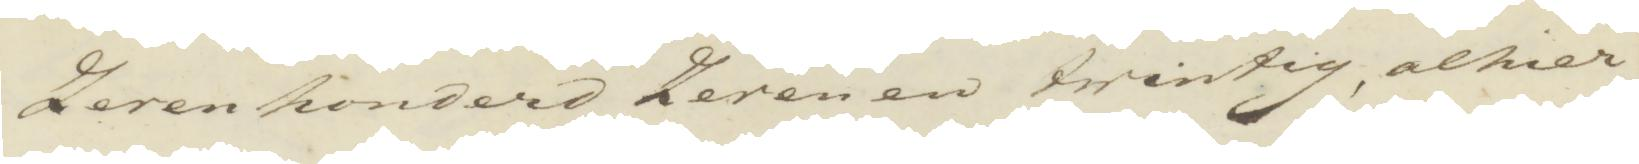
Zevenhonderd Zeven en twintig, alhier,
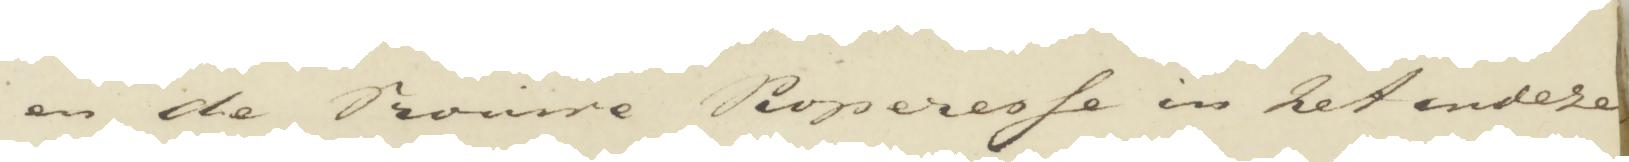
en de Vrouwe Koperesse in het in deze
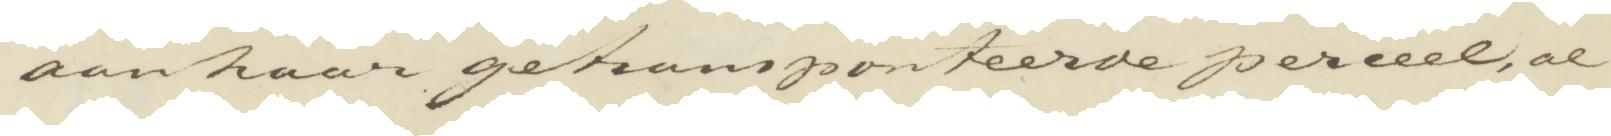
aan haar getransponteerde perceel, al
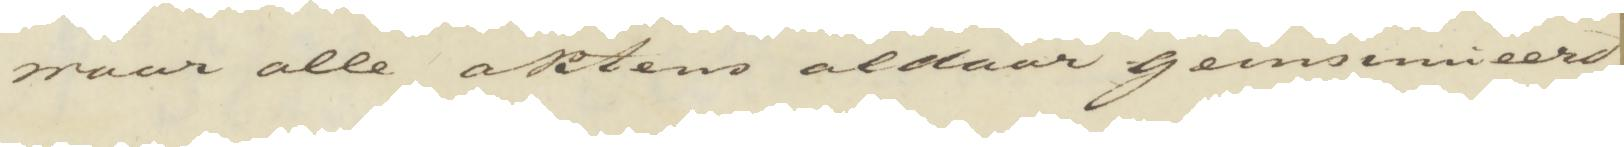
waar alle aktens aldaar geinsinueerd,
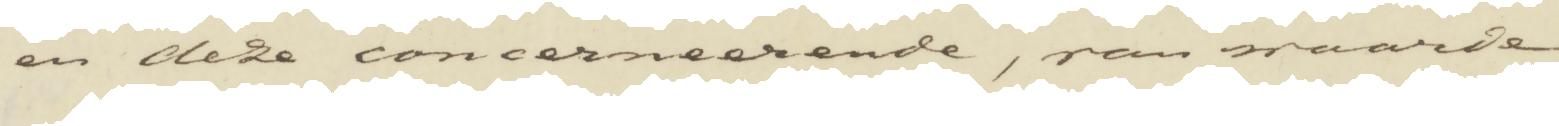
en deze concerneerende, van waarde
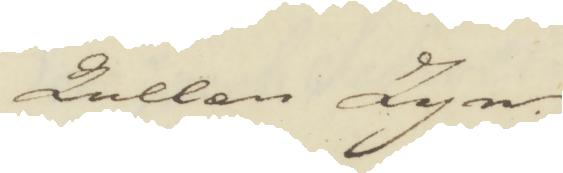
zullen zyn.
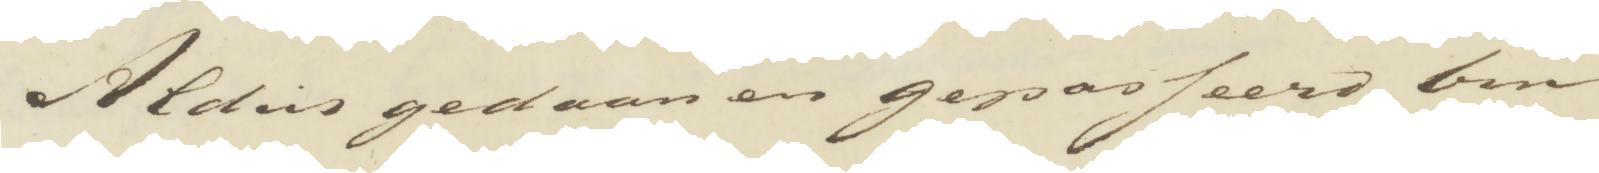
Aldus gedaan en gepasseerd, bin
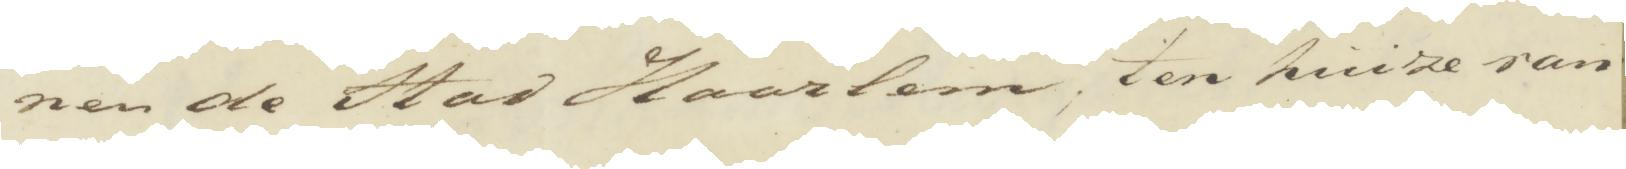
nen de stad Haarlem, ten huize van
